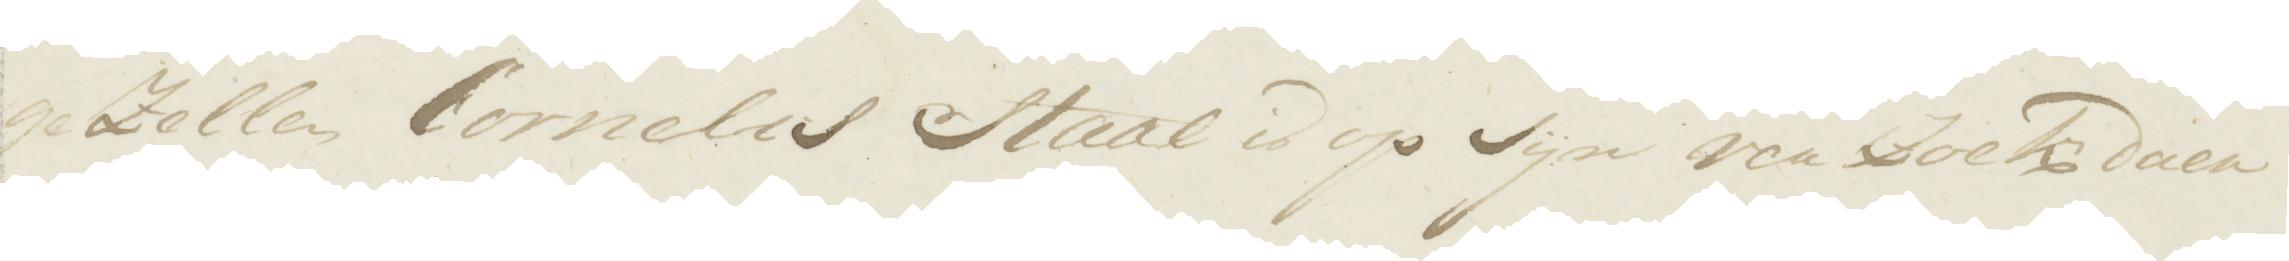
gezellen Cornelis Staal is op sijn verzoek daer
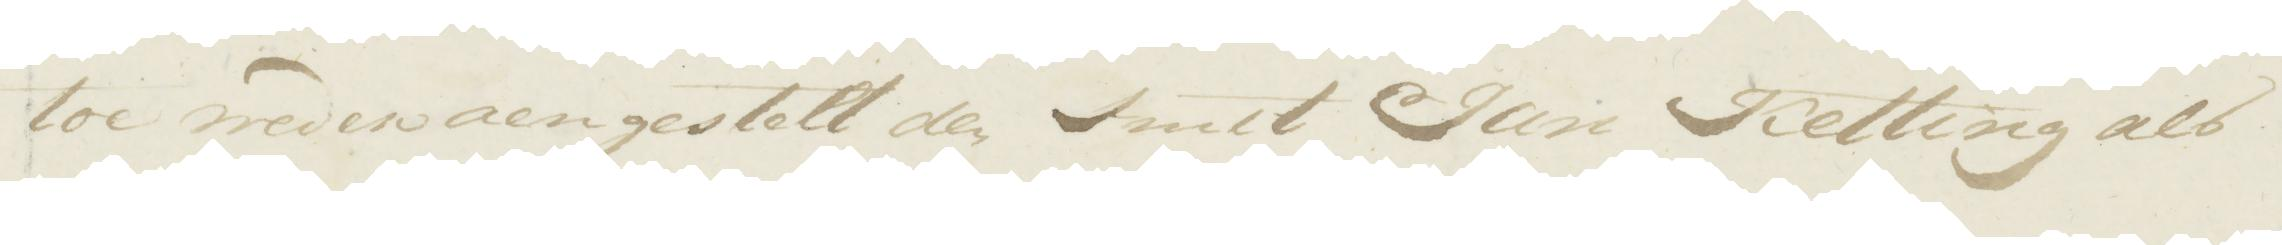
toe weder aengestelt den Smit Ian Ketting als
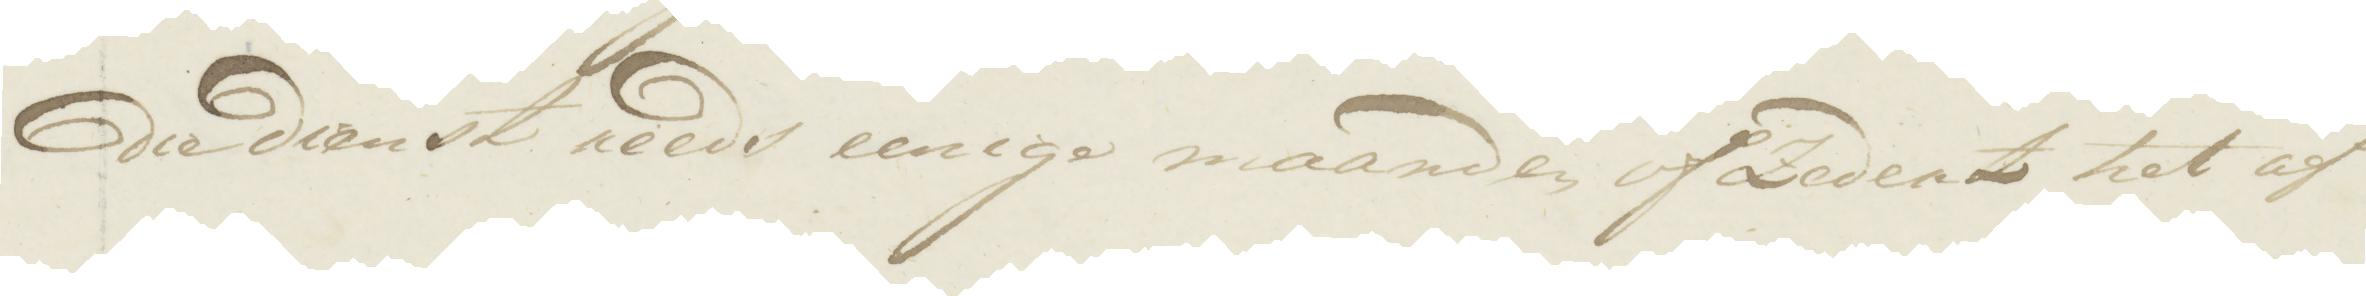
die dienst reede eenige maanden of zedert het af
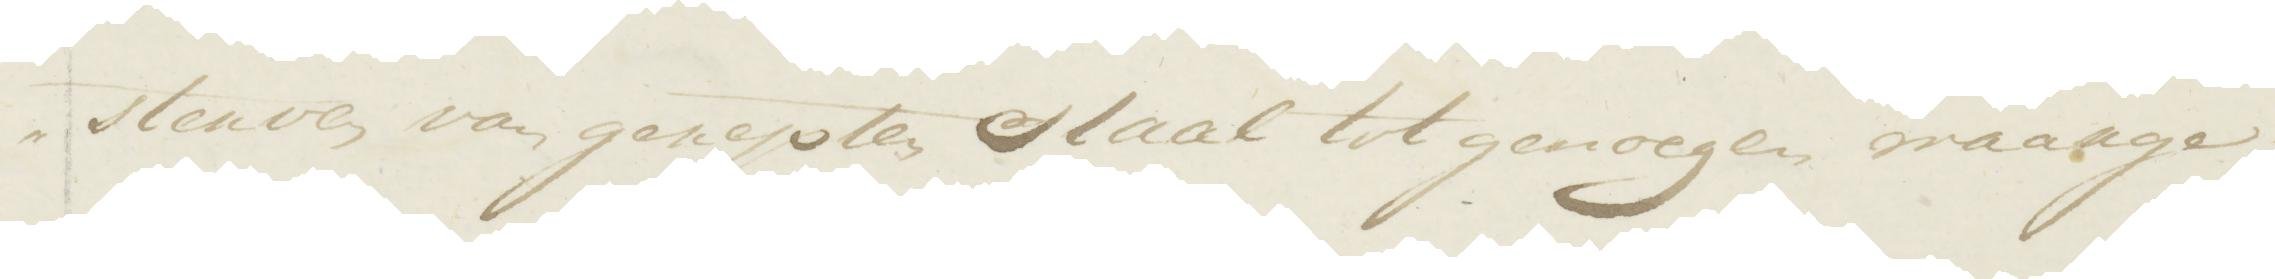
„ sterven van gerepten Staal tot genoegen waarge
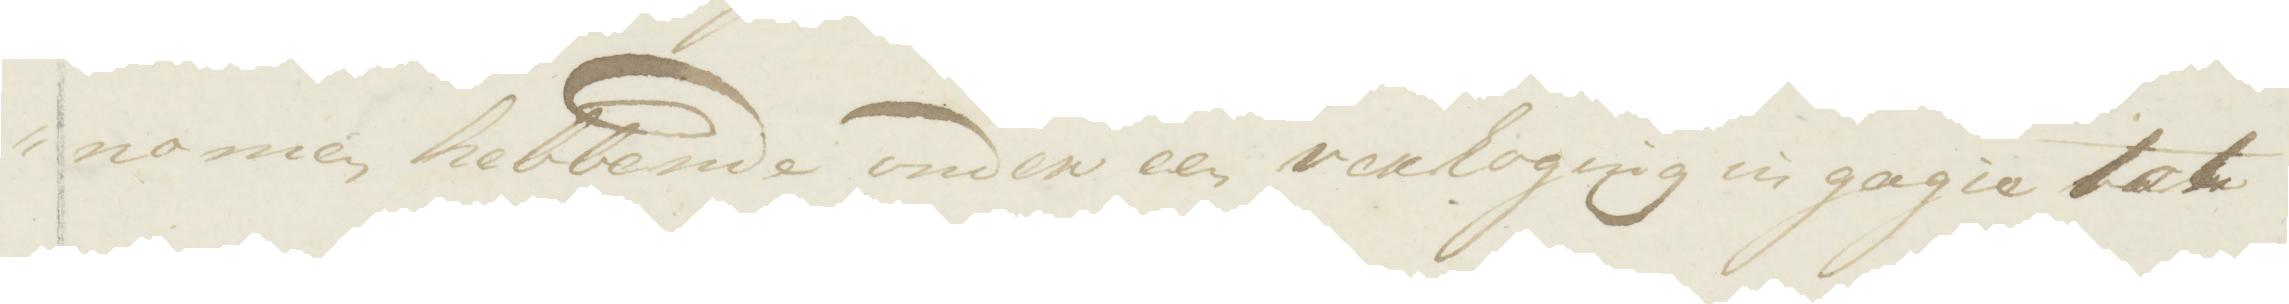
„nomen hebbende onder een verhoging in gagie tot
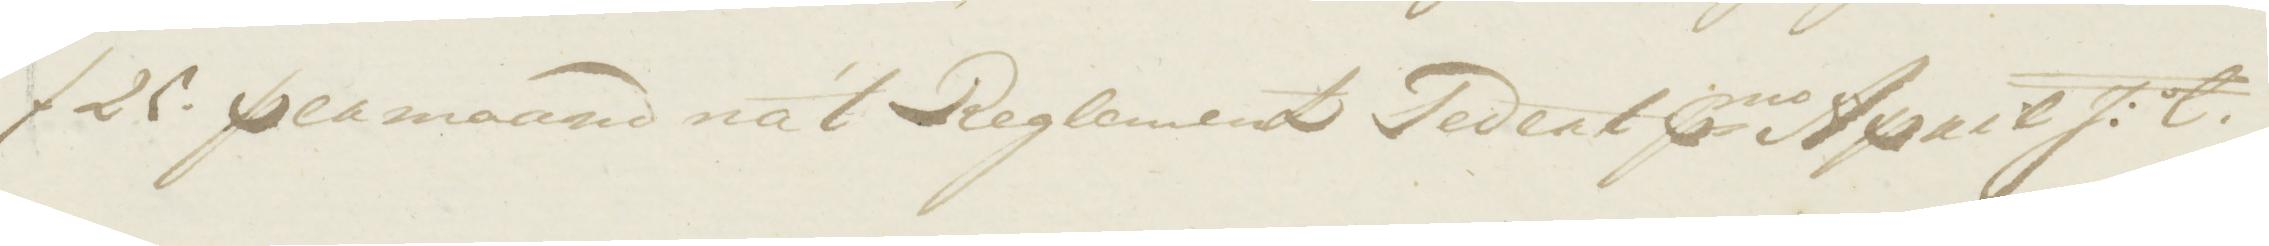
ƒ 25. per maand na ’t Reglement sedert p=mo April J:ol.
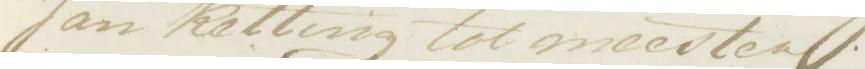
Jan Ketting tot meester
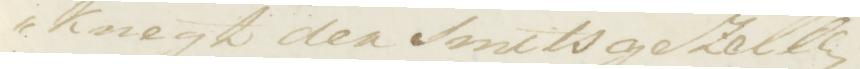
„knegt der smitsgezellen
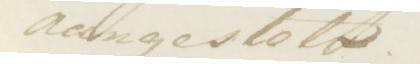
aangestelt.
